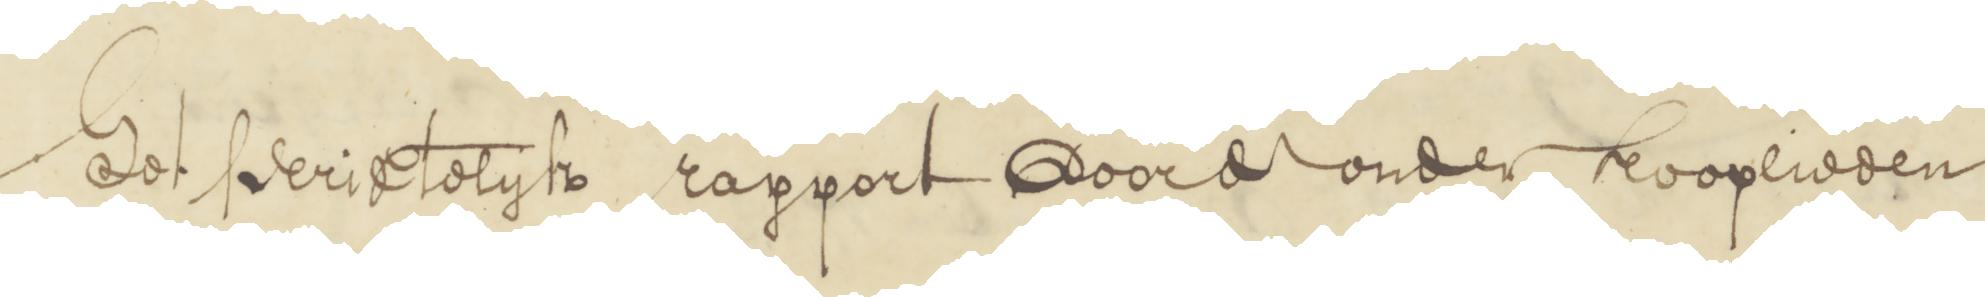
Het schriftelijk rapport door de onder kooplieden
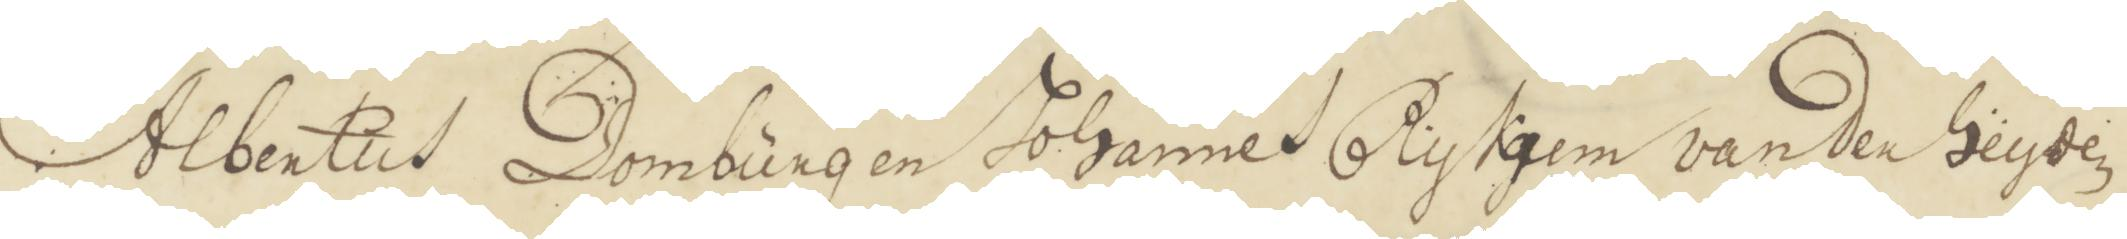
Albertus Domburg en Iohannes Rijkgem van der Heijden
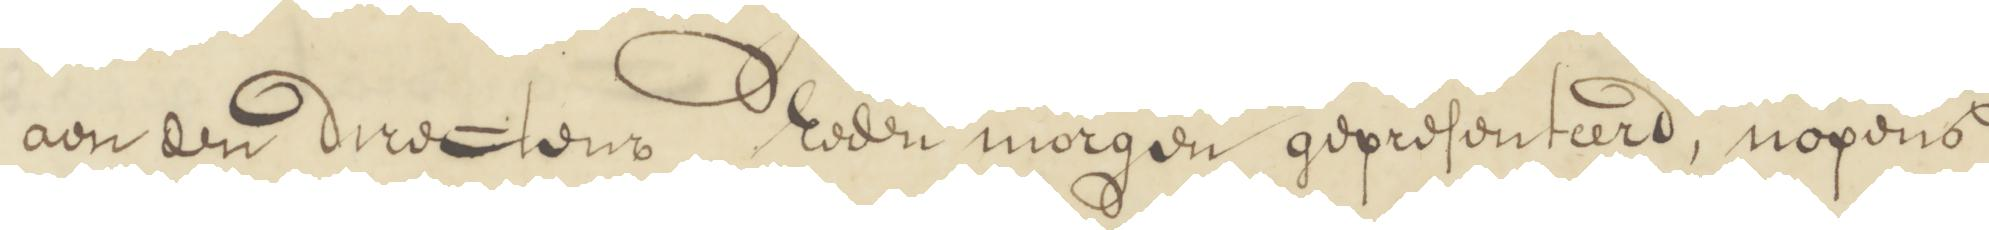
aen den directeur heden morgen gepresenteerd, nopens
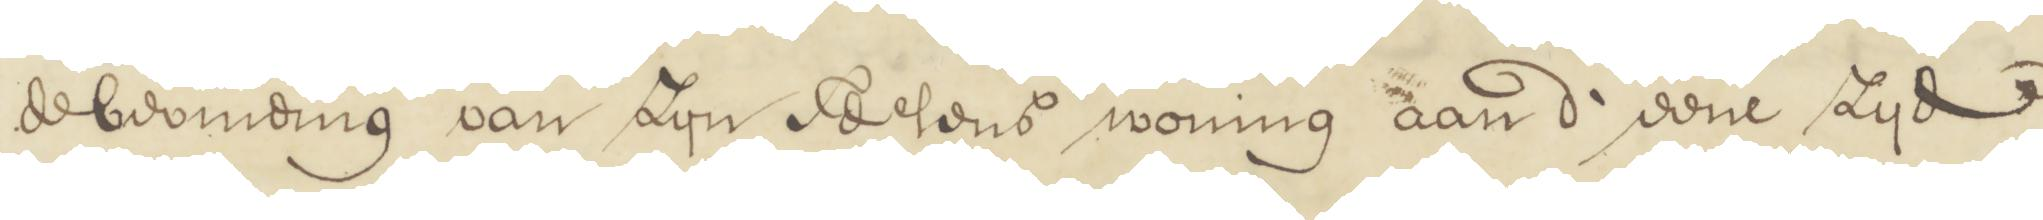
de bevinding van zyn Edelens woning aan d’ eene zyde
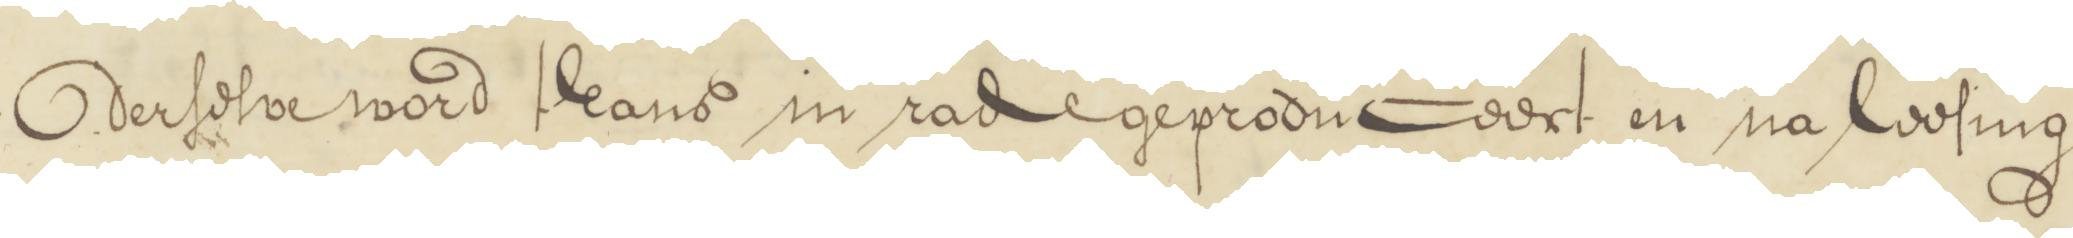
derselve word thans in rade geproduceert en na leesing
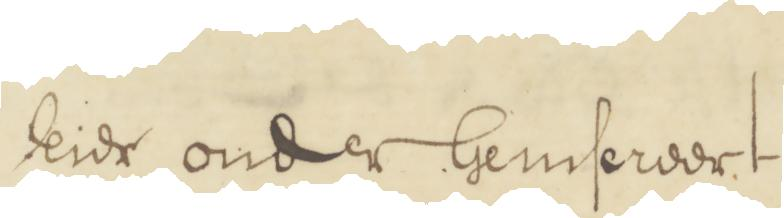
hier onder Geinsereert
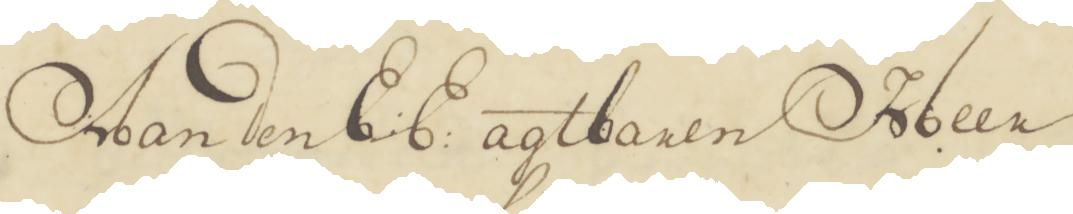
Aan den E: E: agtbaren Heer
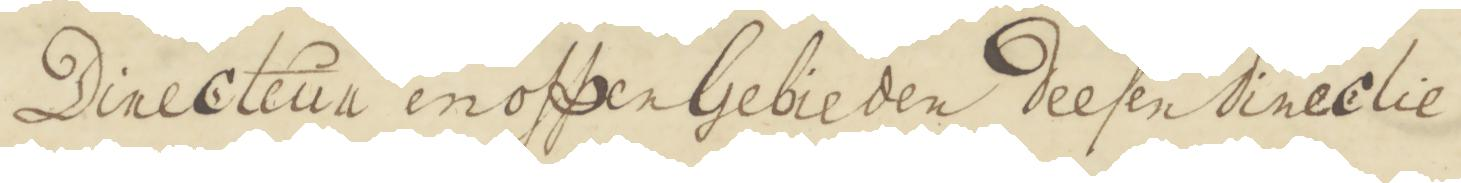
Directeur en opper Gebieder deeser directie
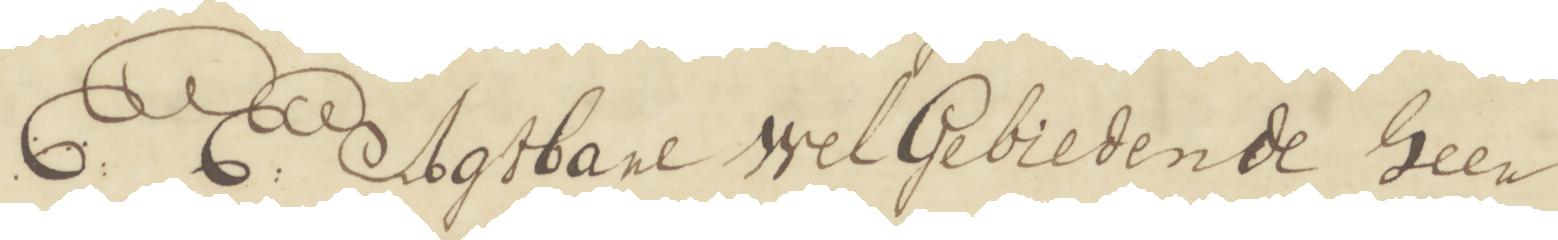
E: E: Agtbare wel Gebiedende Heer
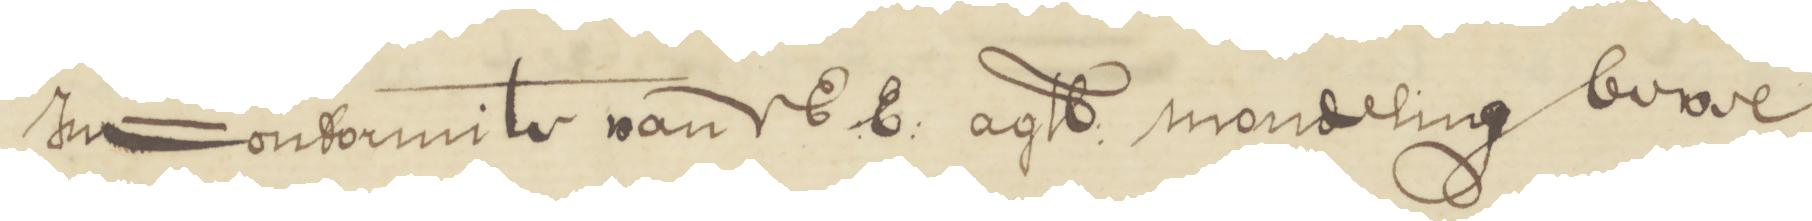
In conformite van VE: E: agtb: mondeling bevel
